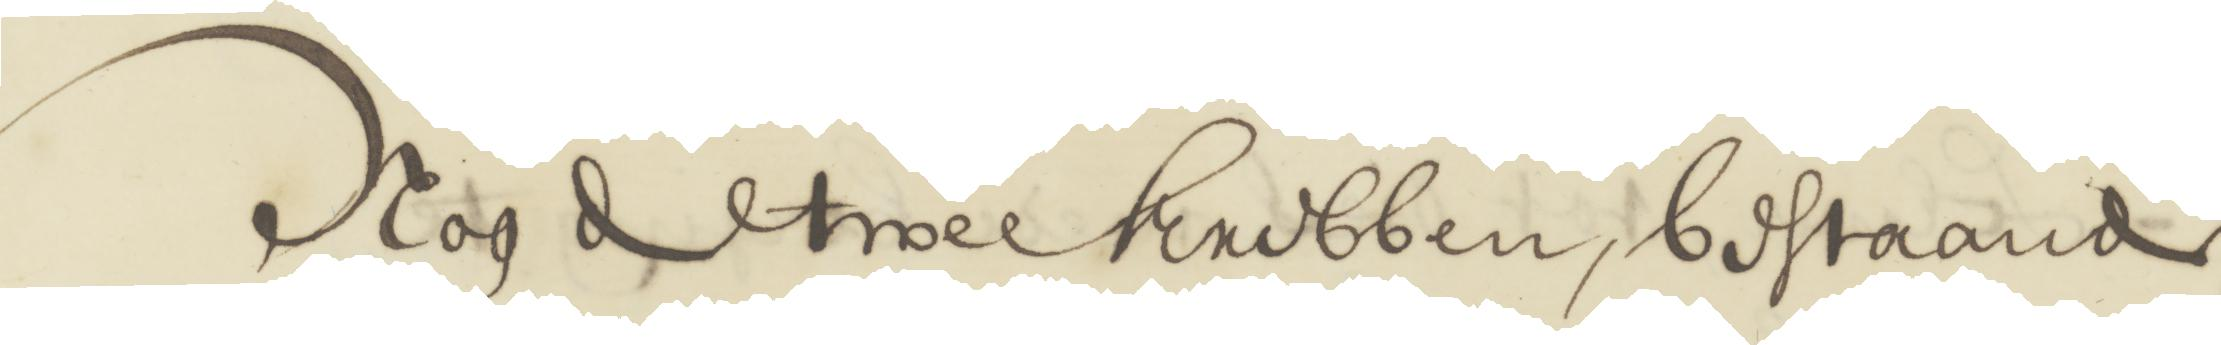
Nog de twee krebben, bestaande
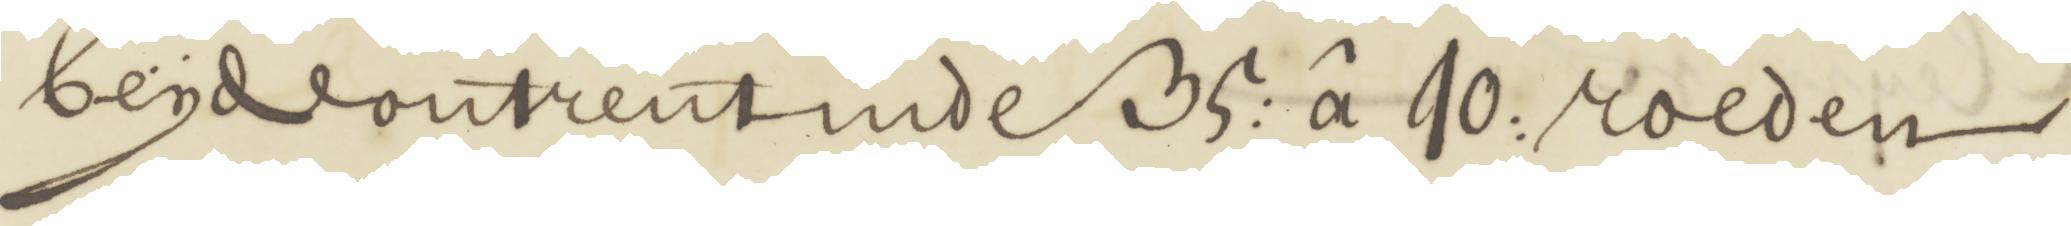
beijde ontrent inde 35: â 40: roeden
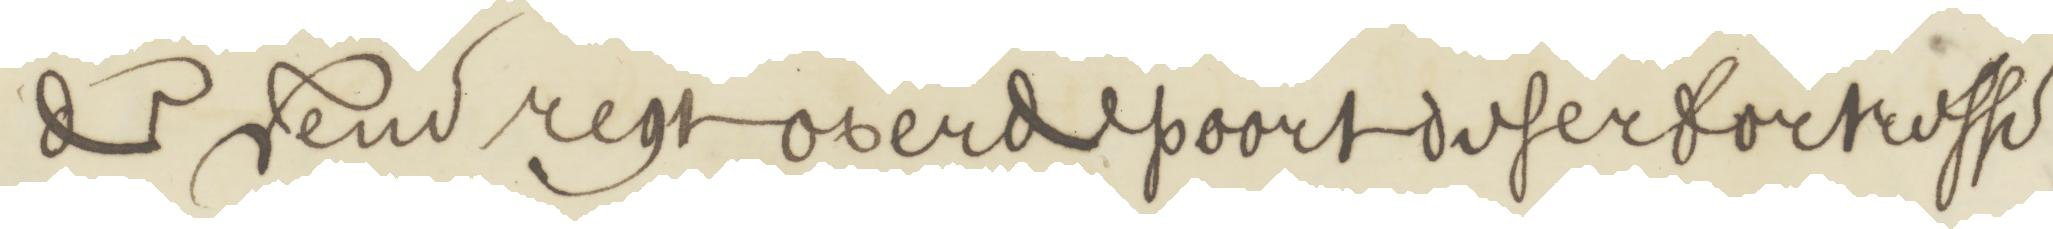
de Eene regt over de poort deser fortresse
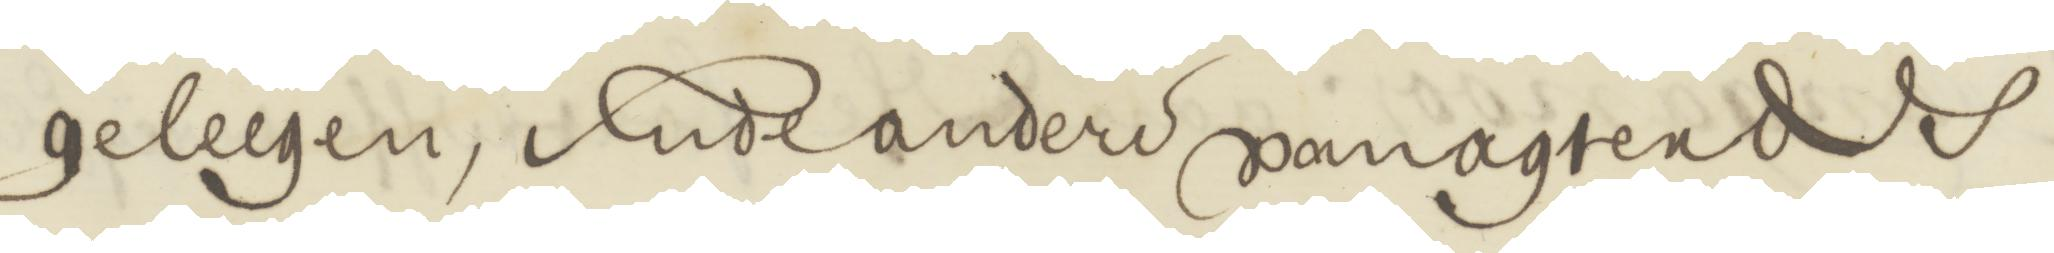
geleegen, Ende andere van agter des
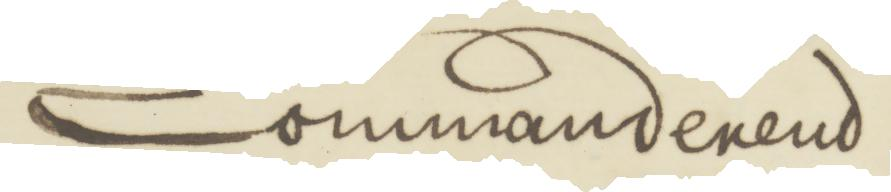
commanderend
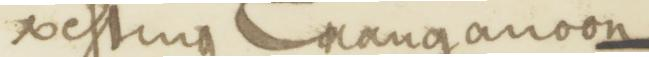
vesting Cranganoor
